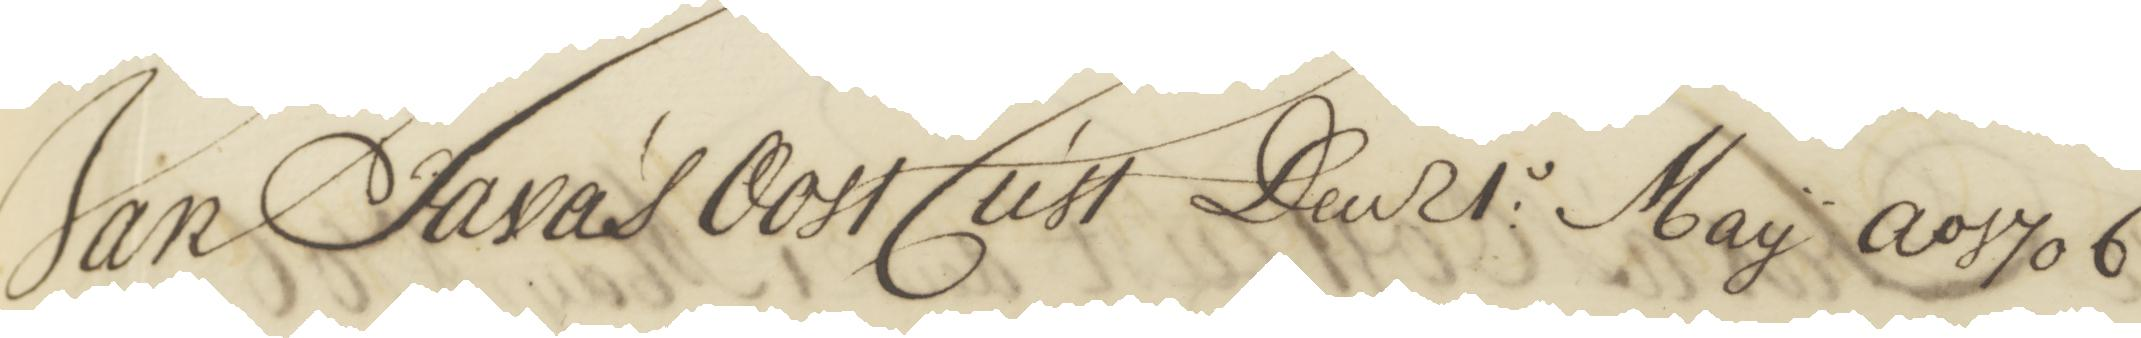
Van Java's Oost Cust Den 21:e Maij A:o 1706
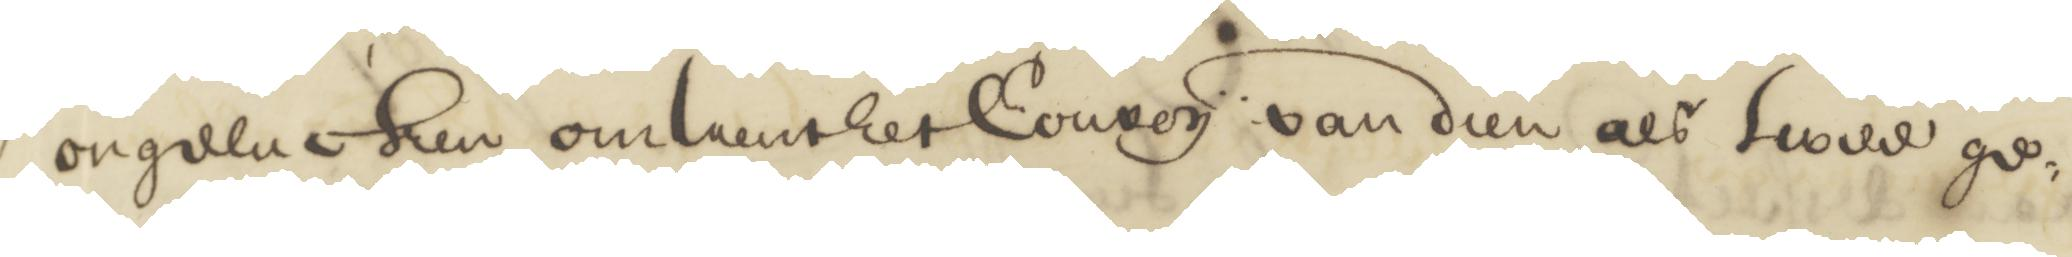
ongelucken omtrent het Convoij van dien als twee ge„
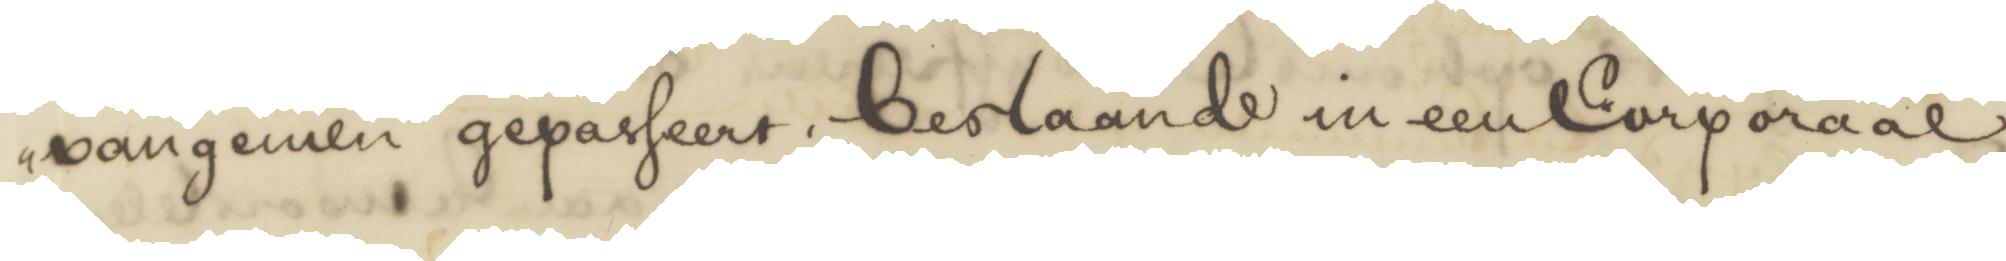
„vangenen gepasseert, bestaande in een Corporaal
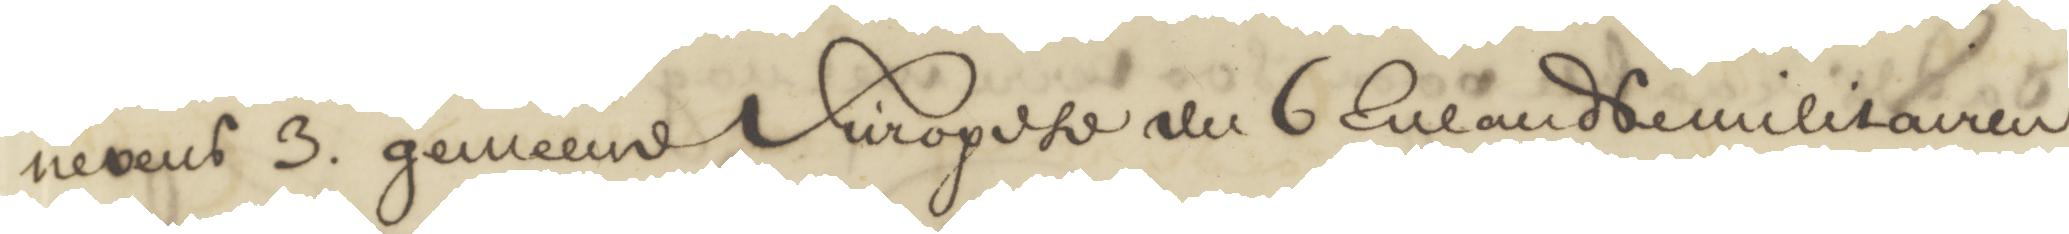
nevens 3. gemeene Europese en 6 Inlandse militairen
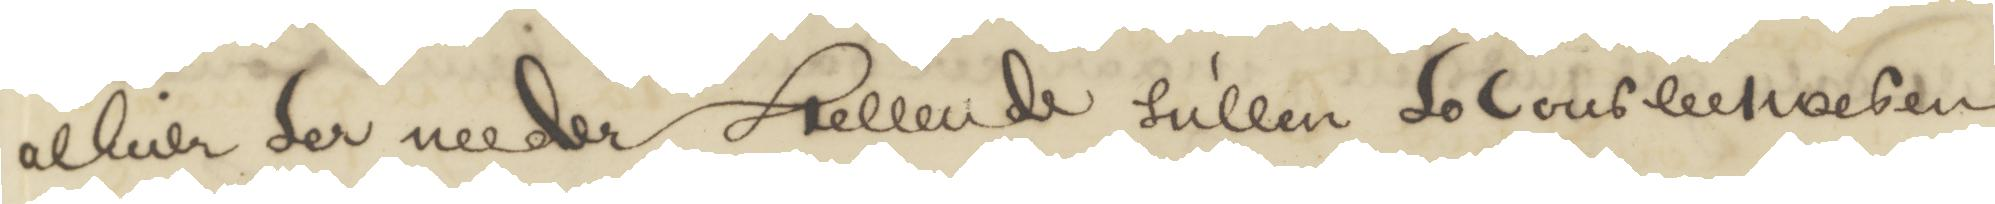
alhier ter needer stellende sullen tot ons leetwesen
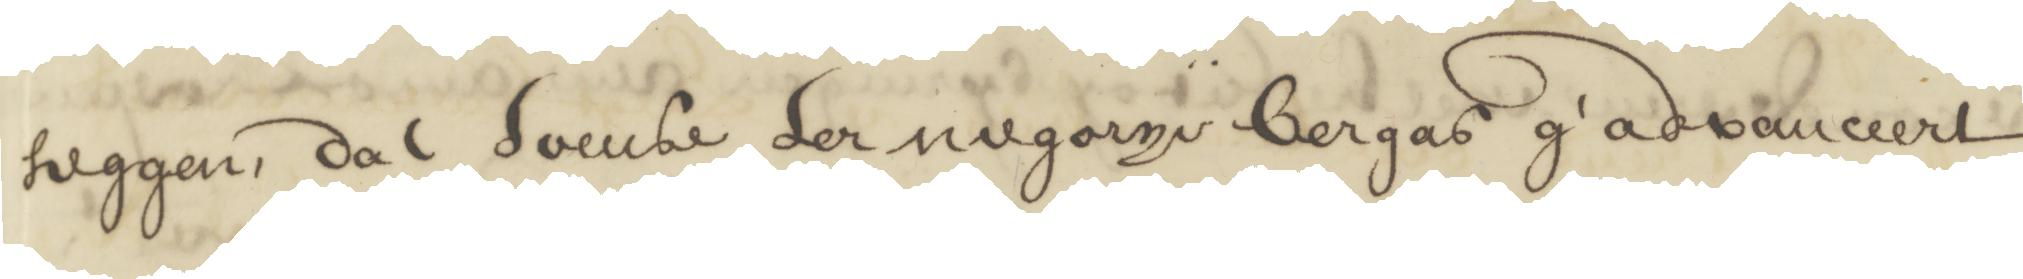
seggen, dat toen se ter negorije bergas g’advanceert
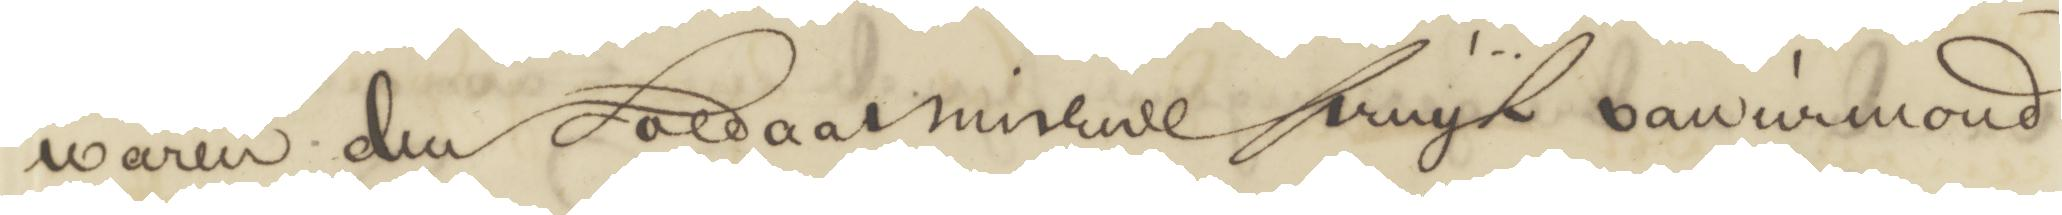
waren den Soldaat michiel Struijk van urmond
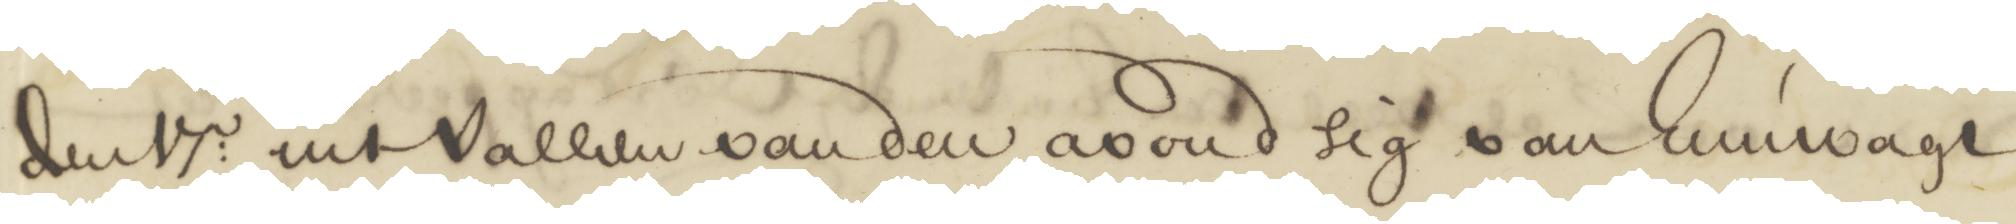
den 17:e in't vallen van den avond sig van hun wagt
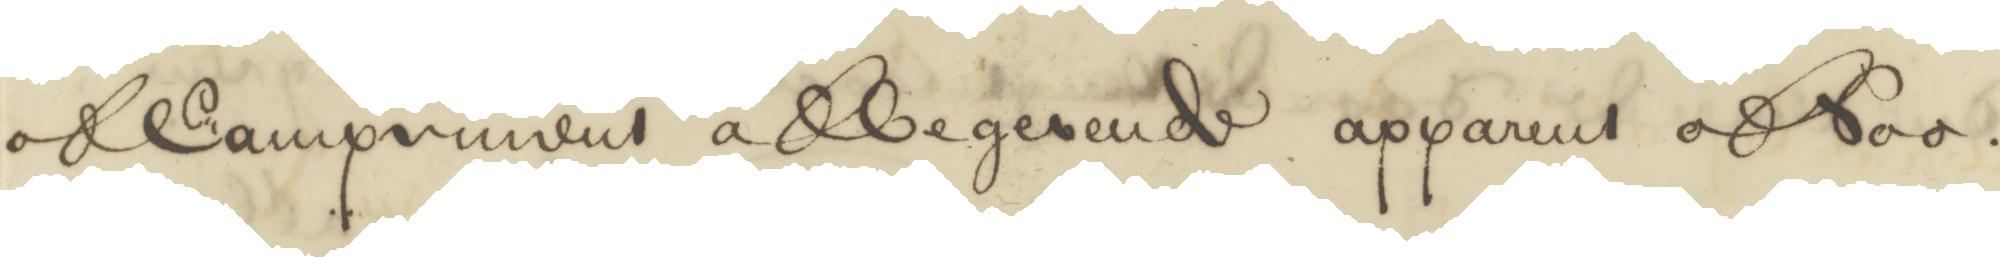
of Campement afbegevende apparent of Soo.
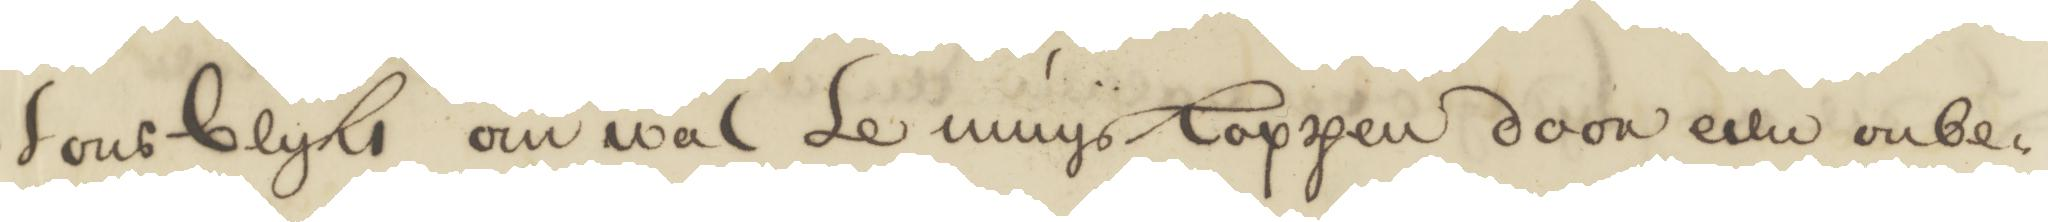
't ons blijkt om wat te muijskoppen door een onbe„
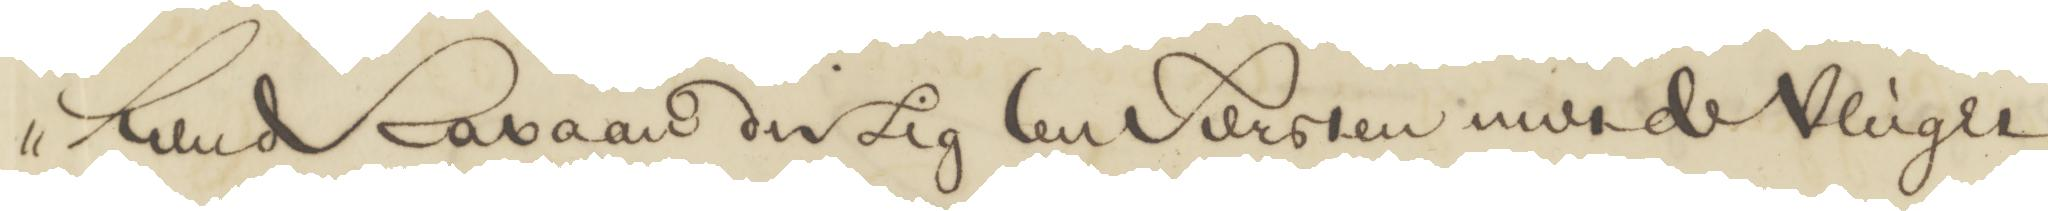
„Kende Javaan die sig ten Eersten met de Vlught
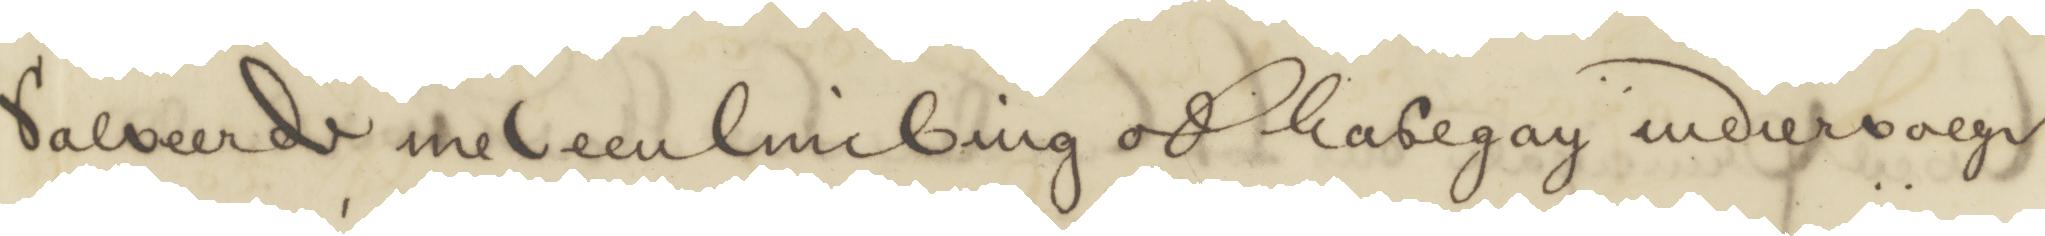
Salveerde met een limbing of hasegaij indier voege
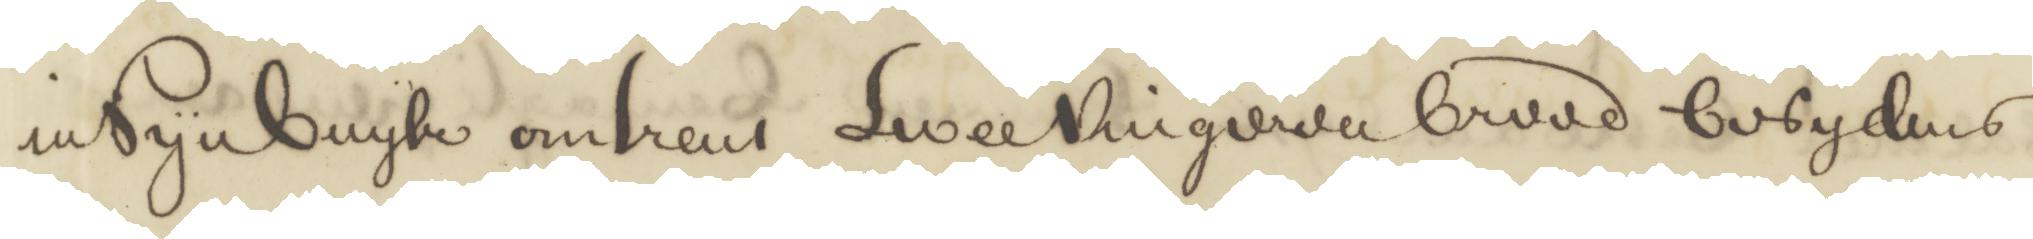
in Sijn buijk omtrend twee Vingeren breed besijdens
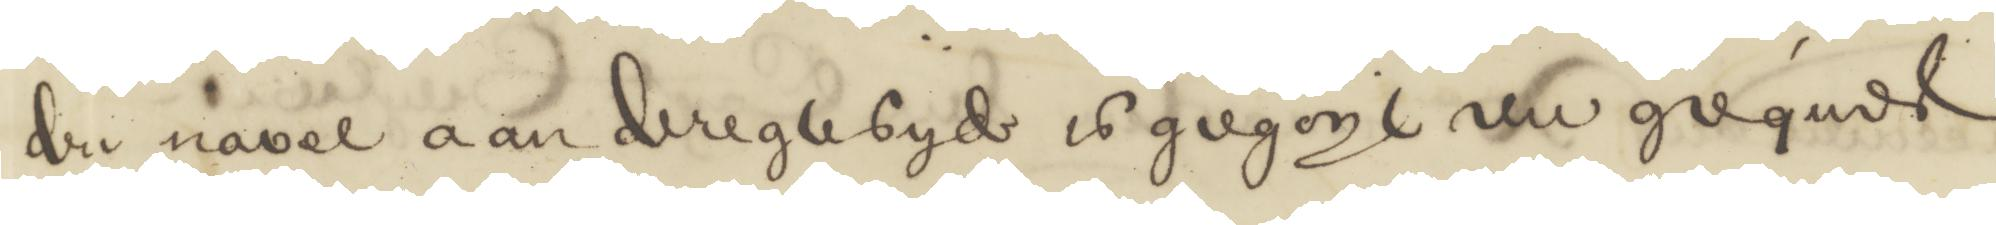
den navel aan de regte sijde is gegoijt en gequest
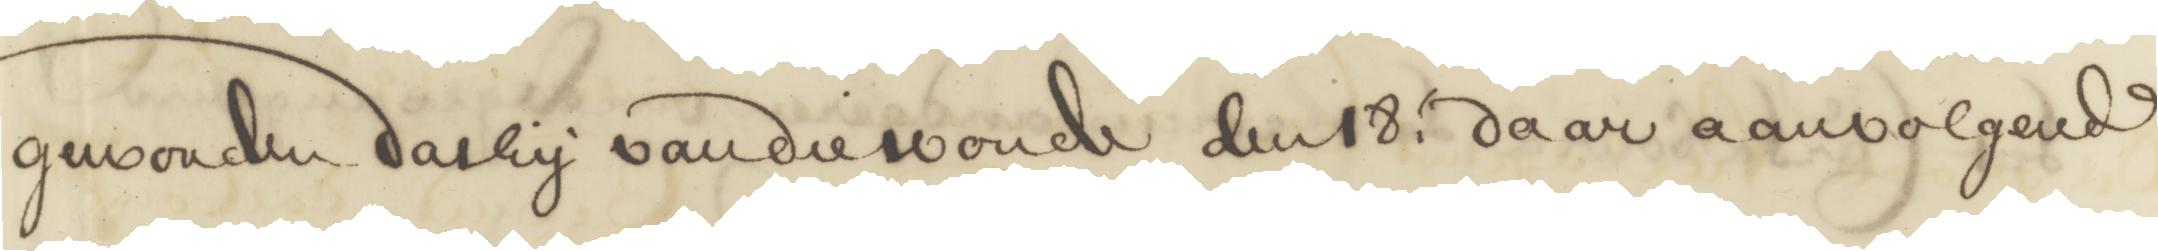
geworden dat hij van die wonde den 18: daar aanvolgende
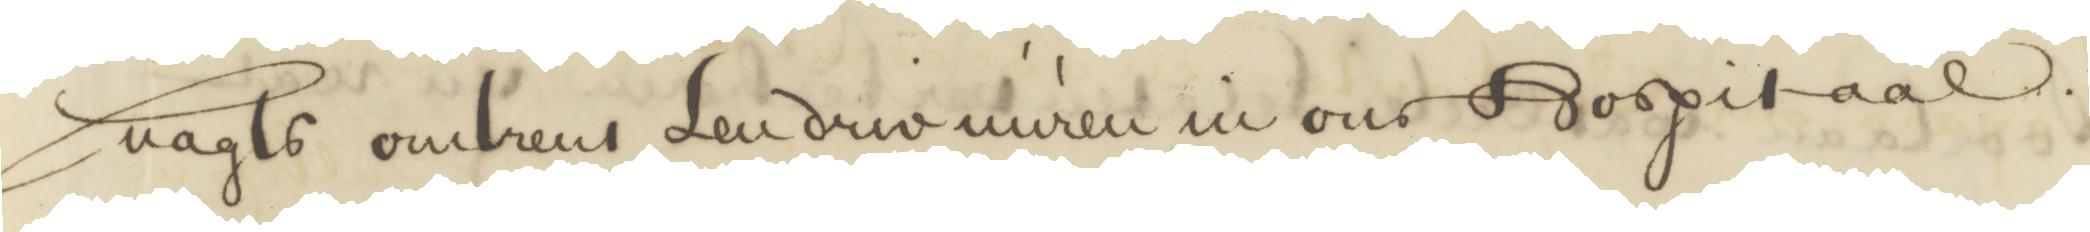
Snagts omtrent ten drie uuren in ons Hospitaal.
